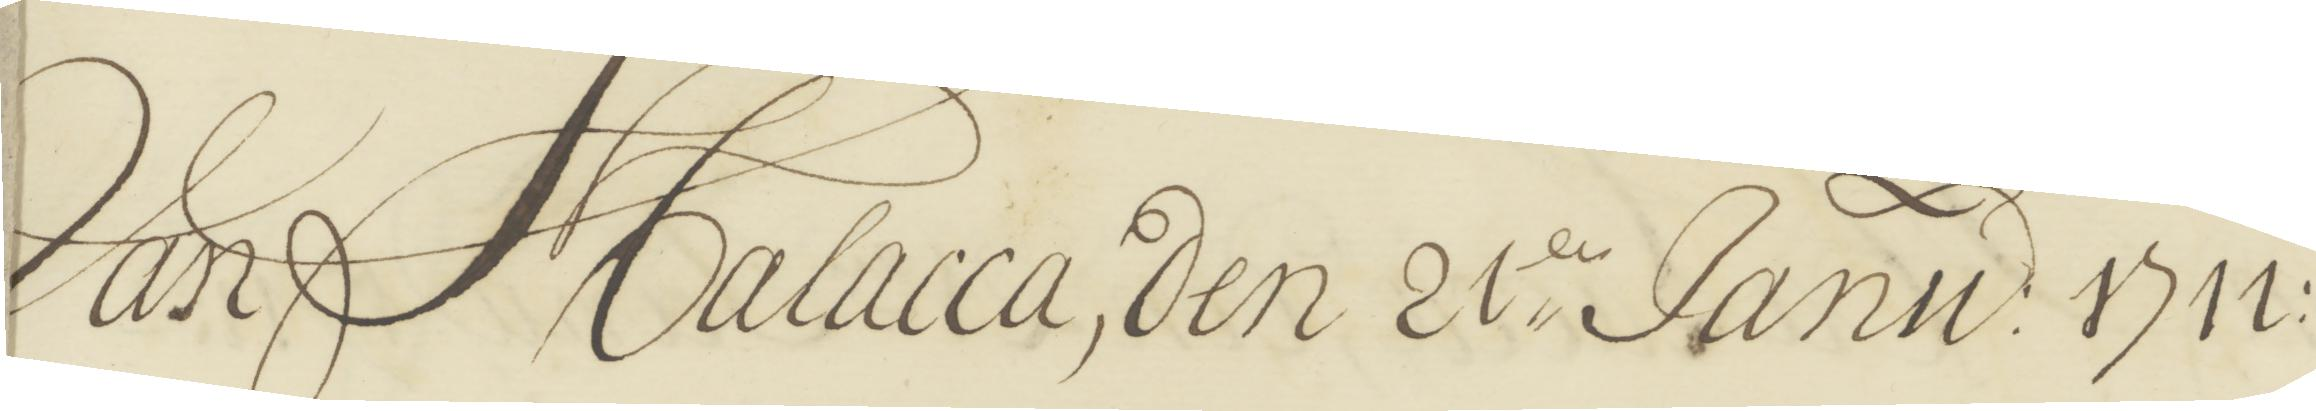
Van Malacca, den 21:en Janu: 1711:
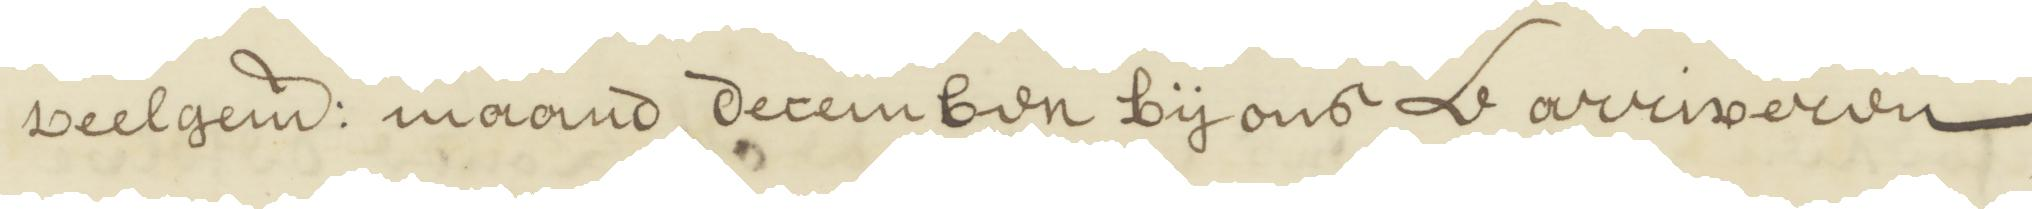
veel gem: maand december bij ons te arriveren,
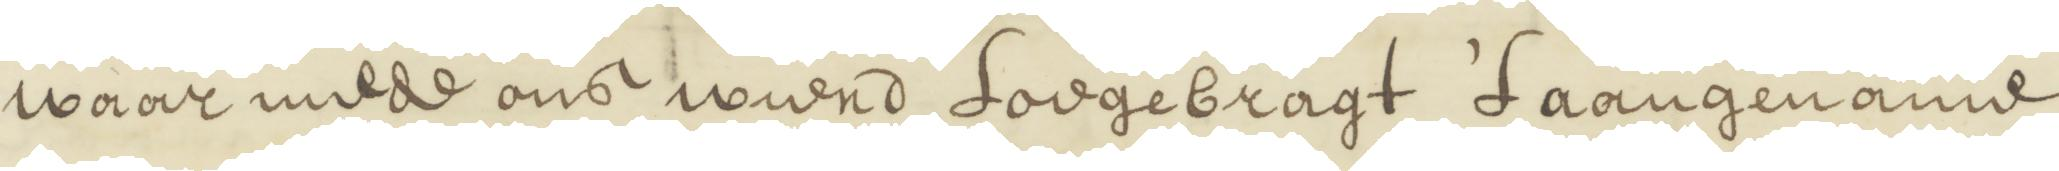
waar mede ons wierd toegebragt 't aangename
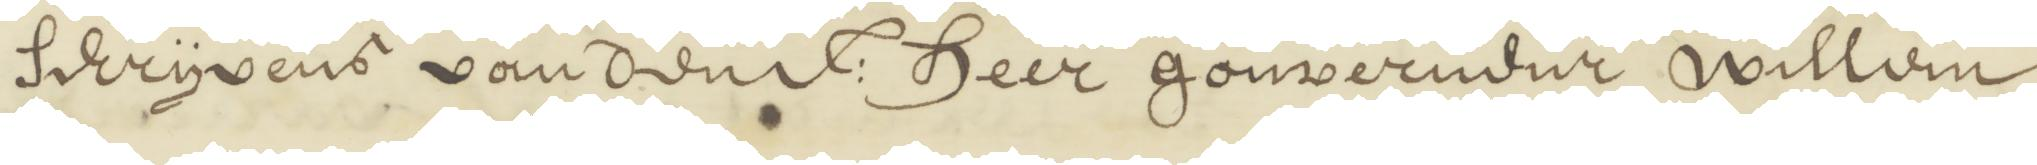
schrijvens van den E: Heer gouverneur willem
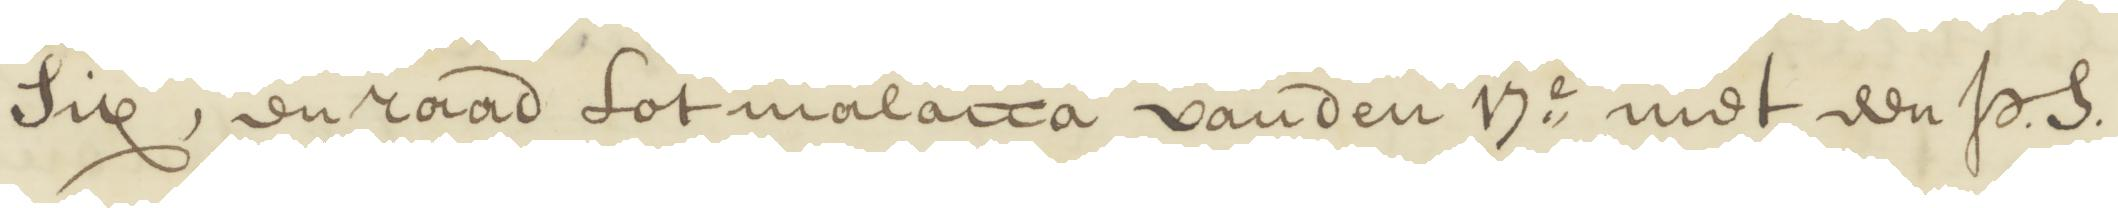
Six, en raad tot malacca van den 17„e met een P. S.
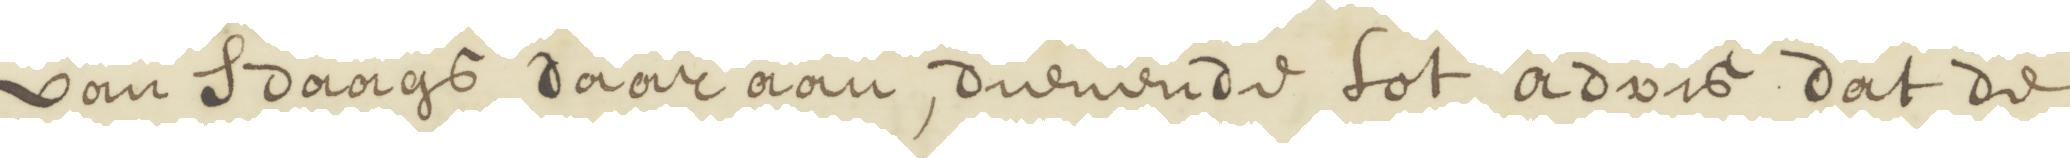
van Sdaags daar aan, dienende tot advis dat de
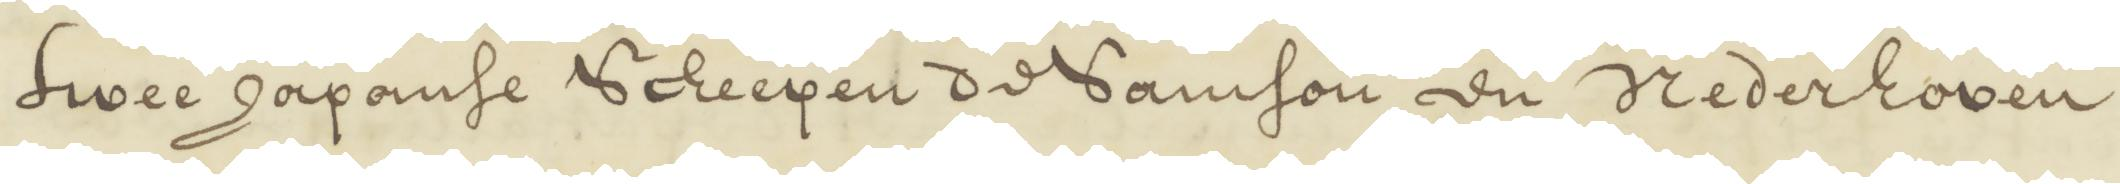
twee japanse Scheepen de Samson en Nederhoven
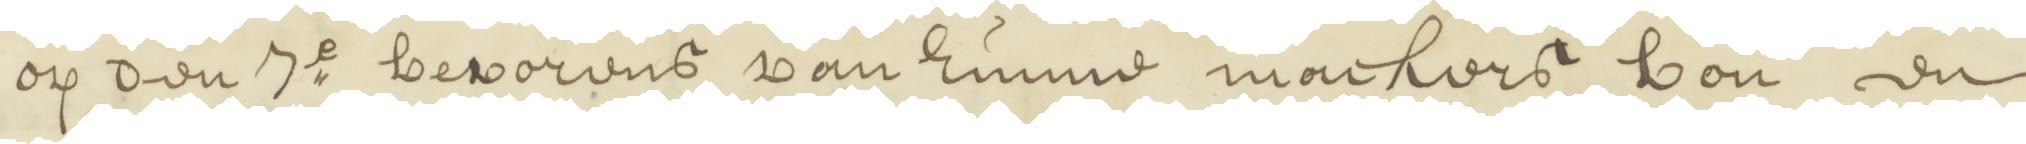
op den 7„e bevorens van hunne mackers bon en
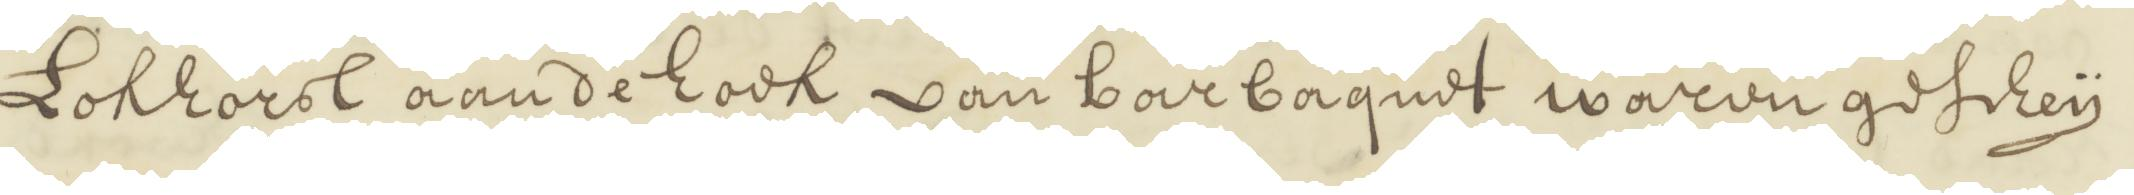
Lokhorst aan de hoek van barbaquet waren gescheij
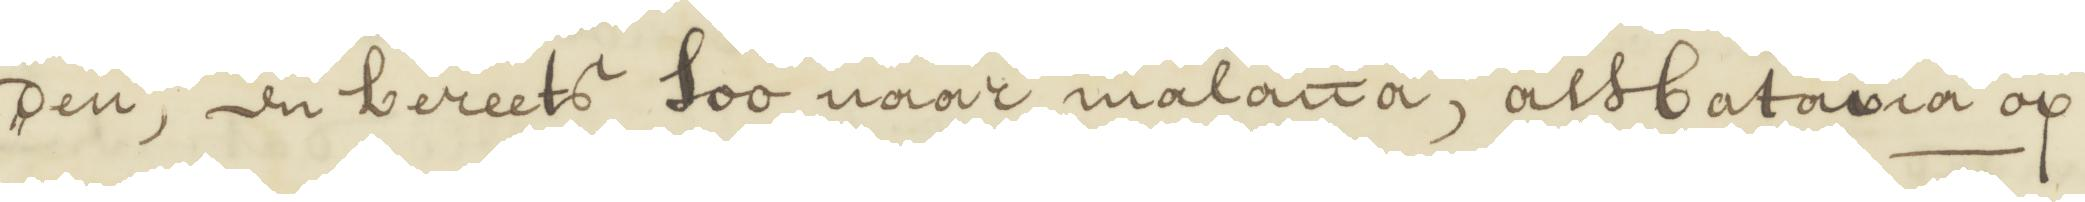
„den, en bereets soo naar malacca, alsbatavia op
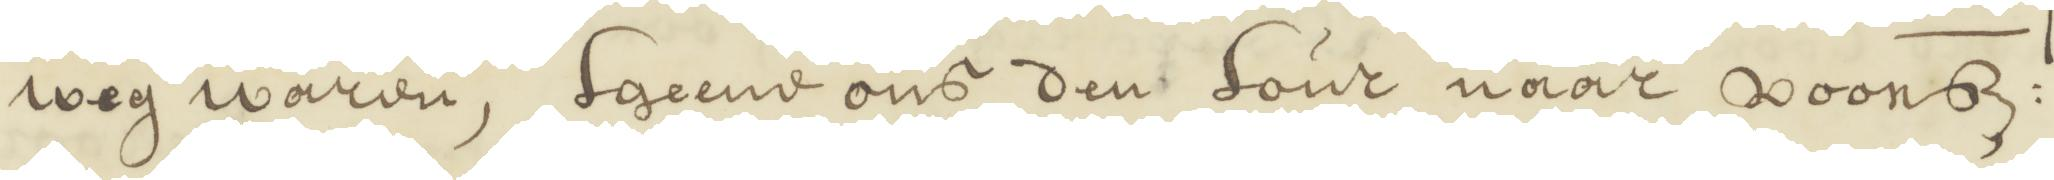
weg waren, 't geene ons den tour naar voors:
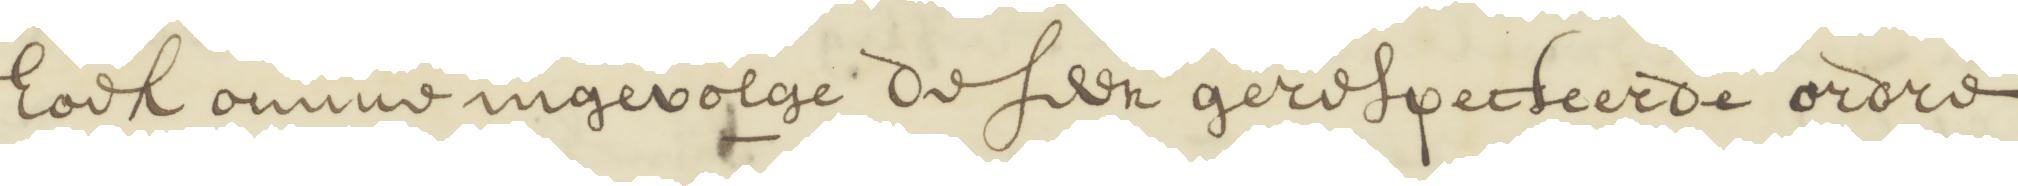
hoek omme ingevolge de seer gerespecteerde ordre
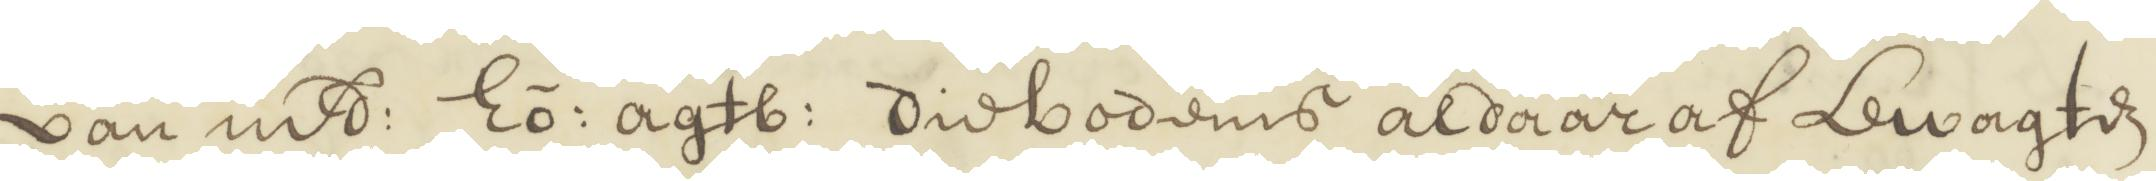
van u Ed: ho. agtb: die bodems aldaar af te wagten,
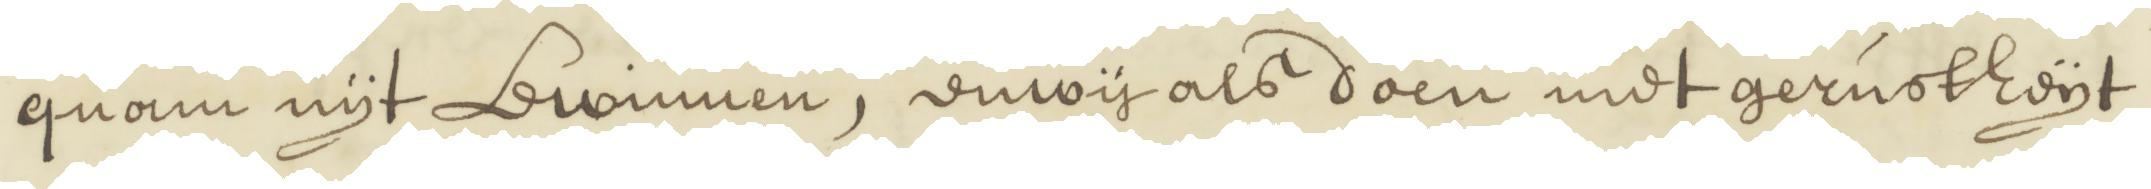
quam uijt te winnen, en wij als doen met gerustheijt
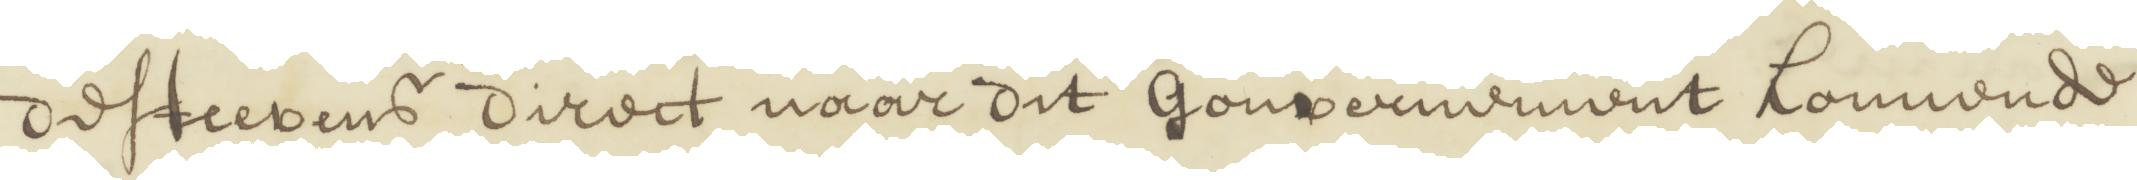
de steevens direct naar dit gouvernement konnende
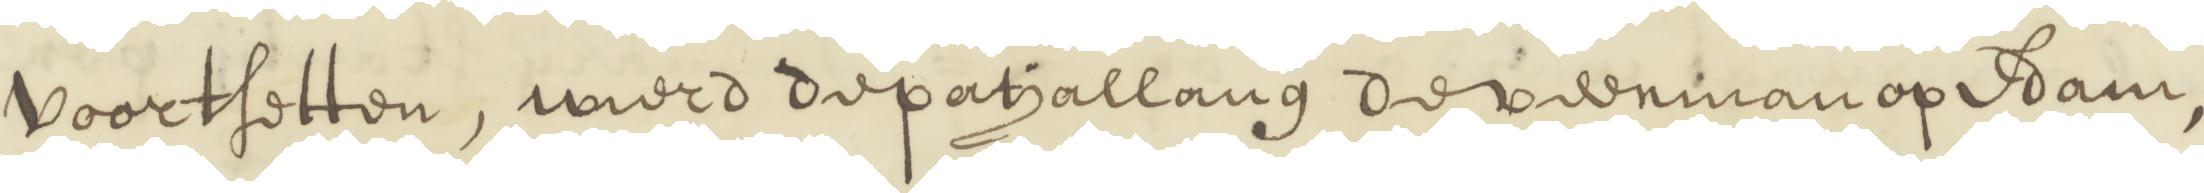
voortsetten, wierd de patjallang de veerman op Edam,
